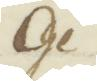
Ge
